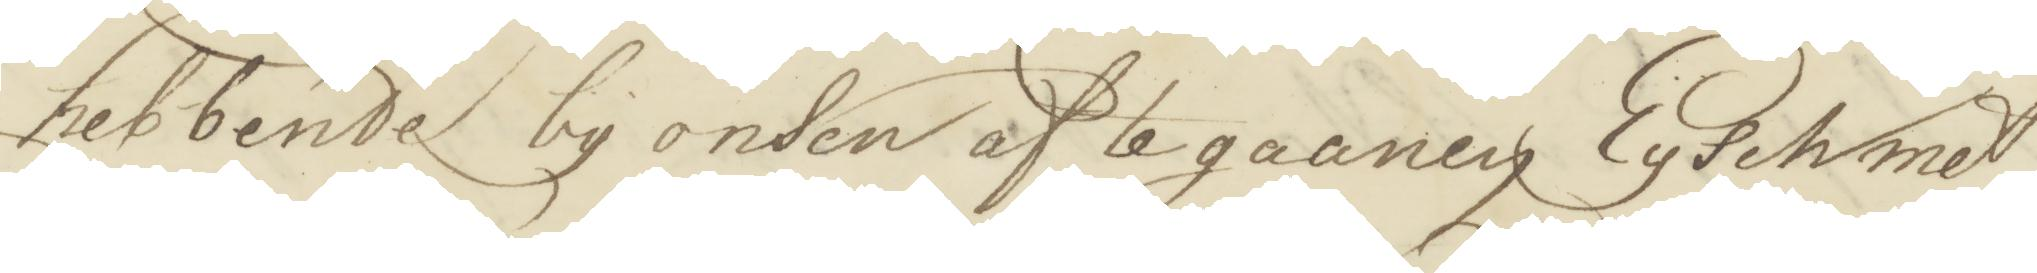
hebbende bij onsen af te gaanen Eijsch met
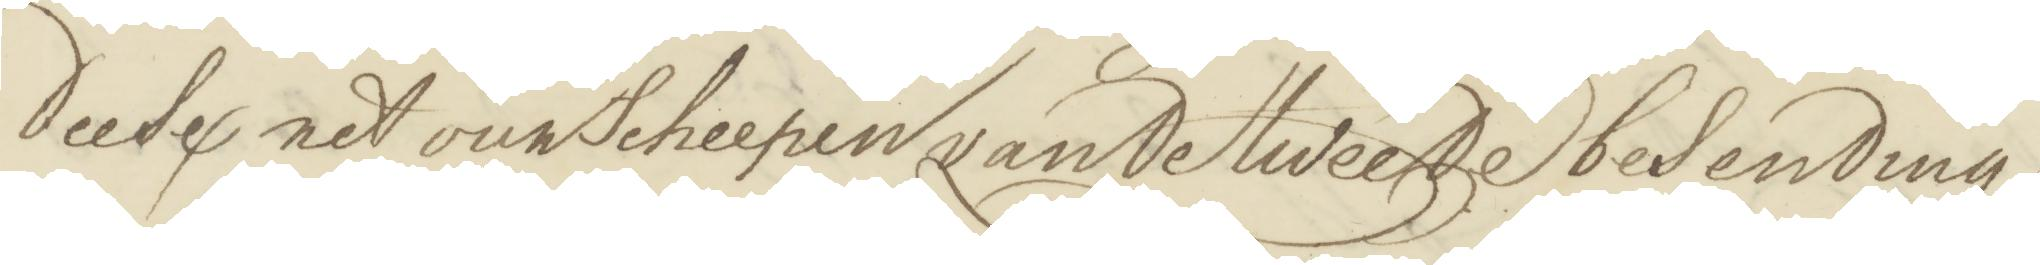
deese retourscheepen van de tweede besending
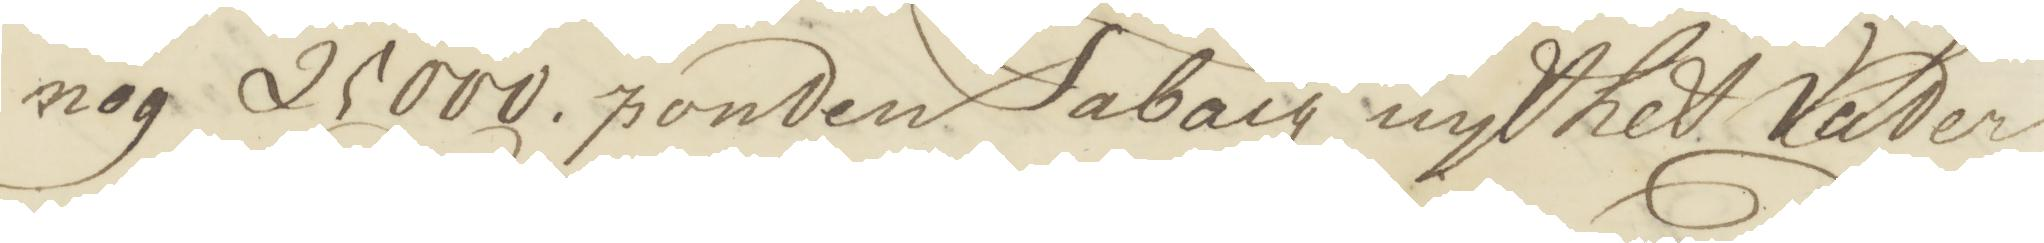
nog 25000. ponden Tabacq uijt het vader
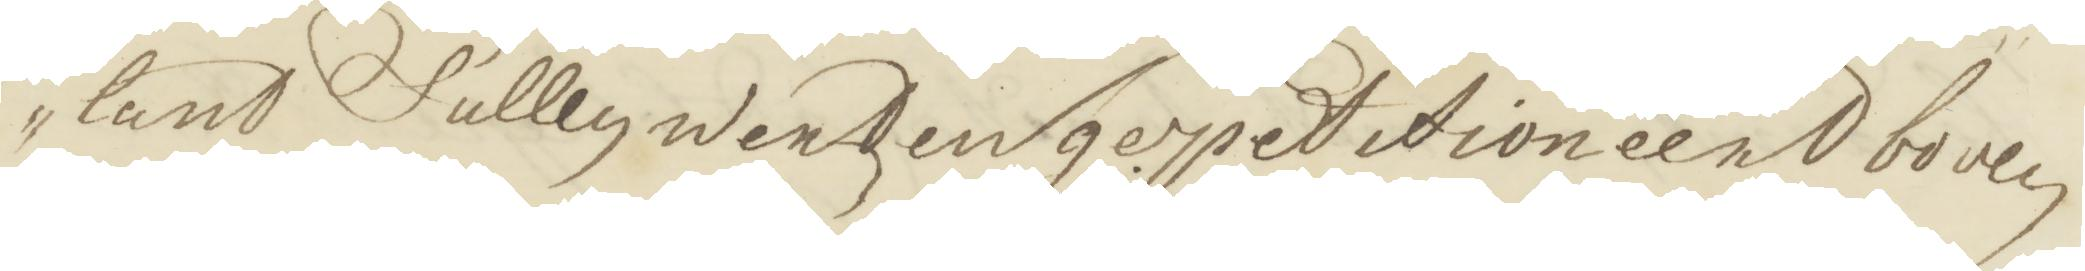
„land sullen werden gepetitioneerd boven
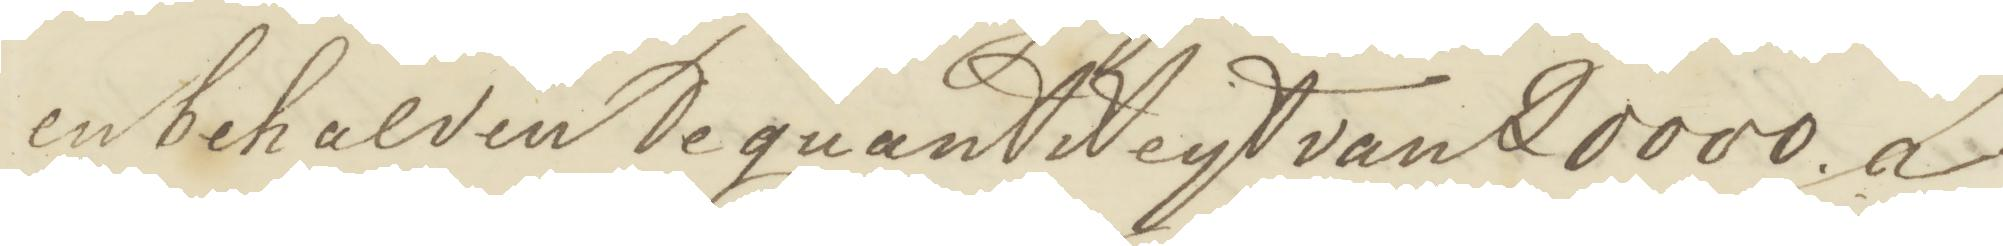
en behalven de quantiteijt van 20000. a
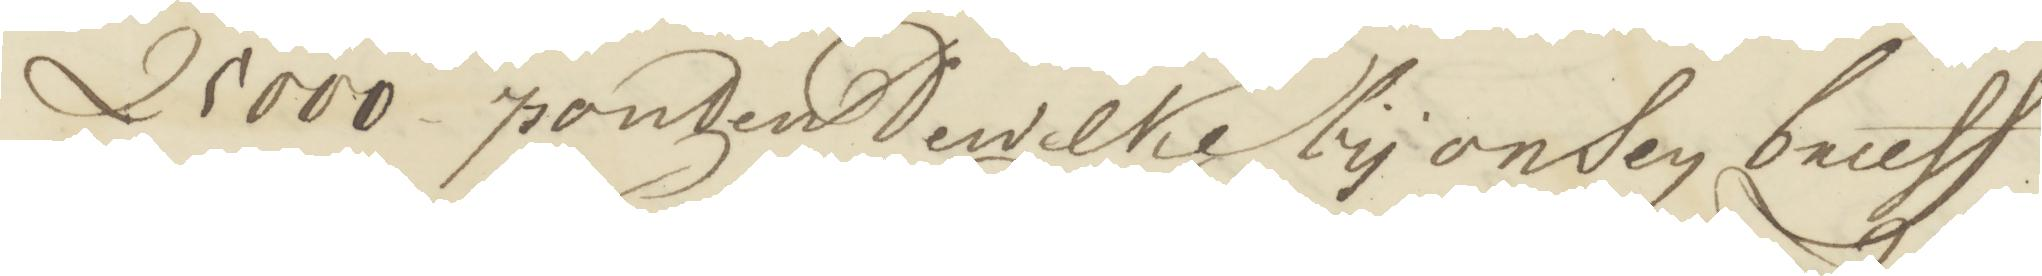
25000 ponden dewelke bij onsen brieff
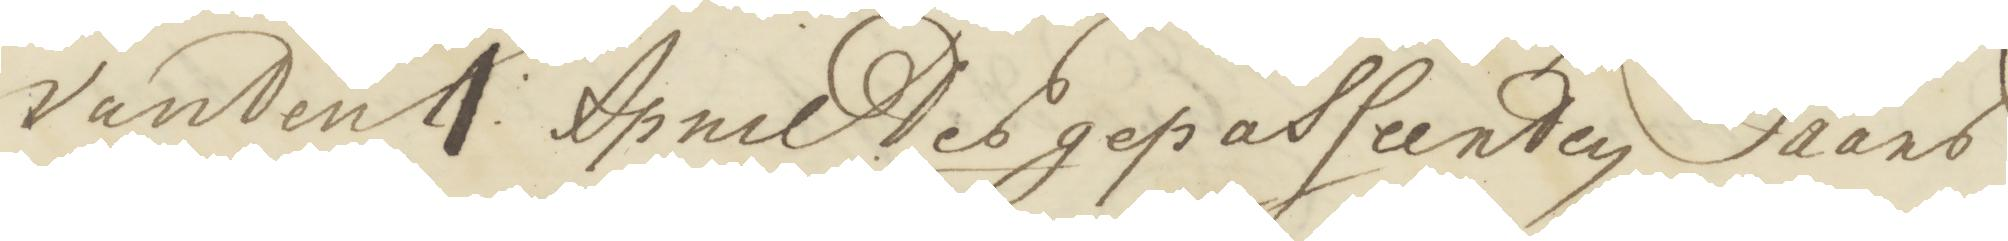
van den 4:' April des gepasseerden Iaars
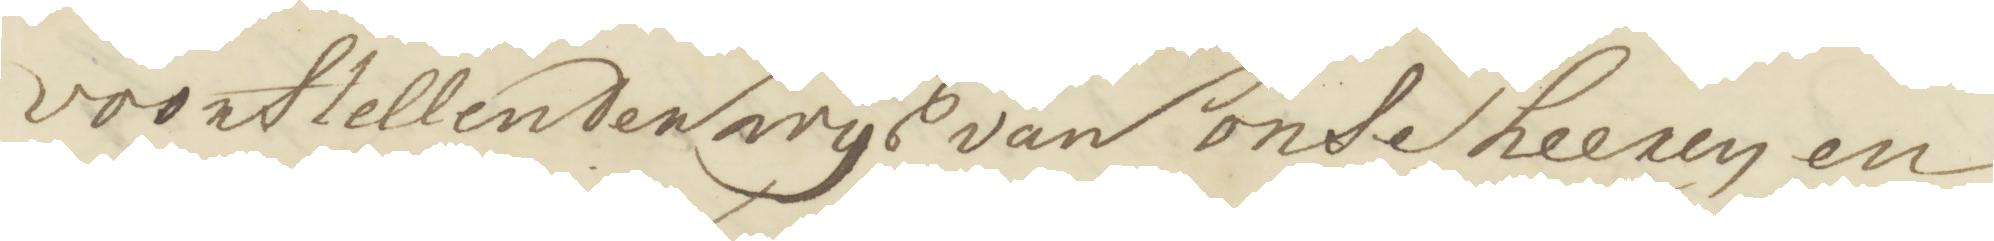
voorstellenden wijs van onse heeren en
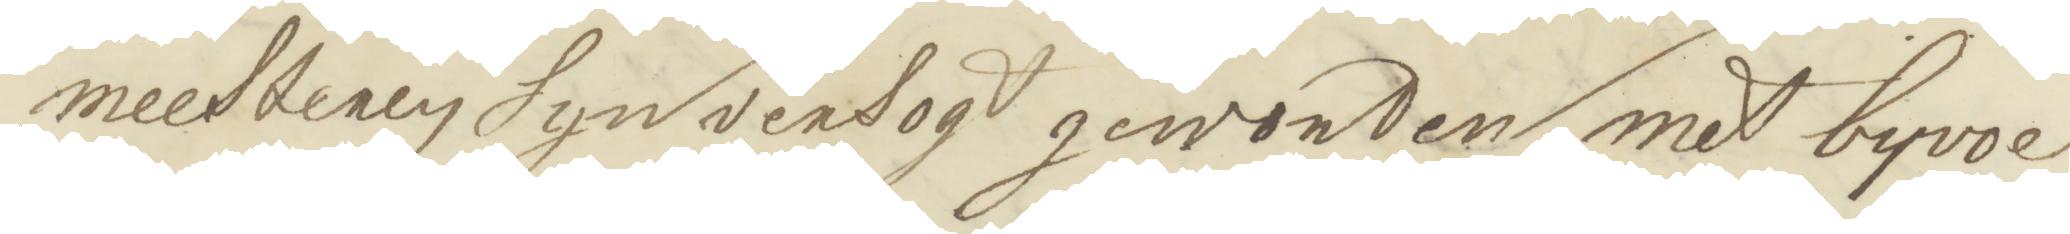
meesteren sijn versogt geworden, met bijvoe
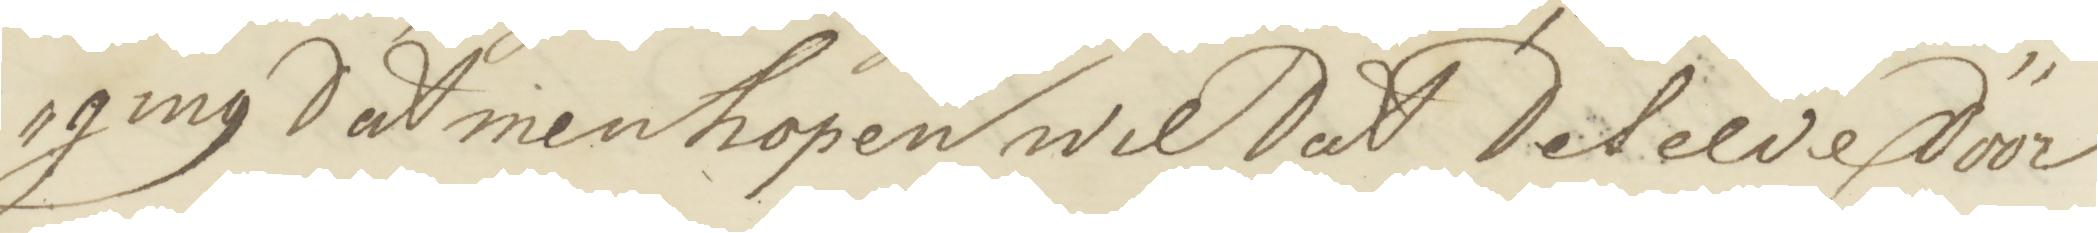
„ging dat men hopen wil dat deselve door
